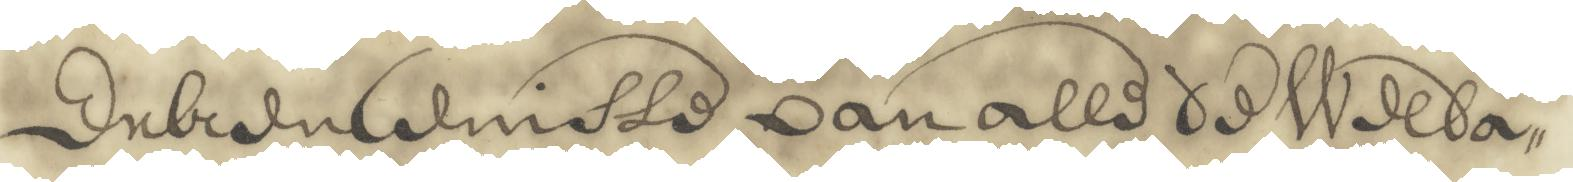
Erkentenisse van alle de Welda„
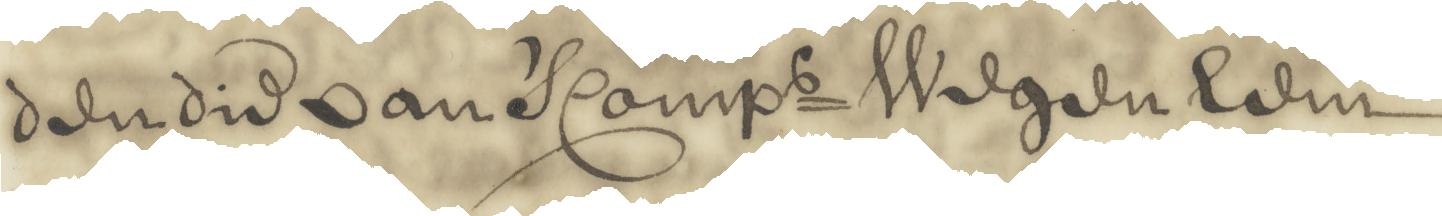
den die van ’s Comp=s Wegen hem
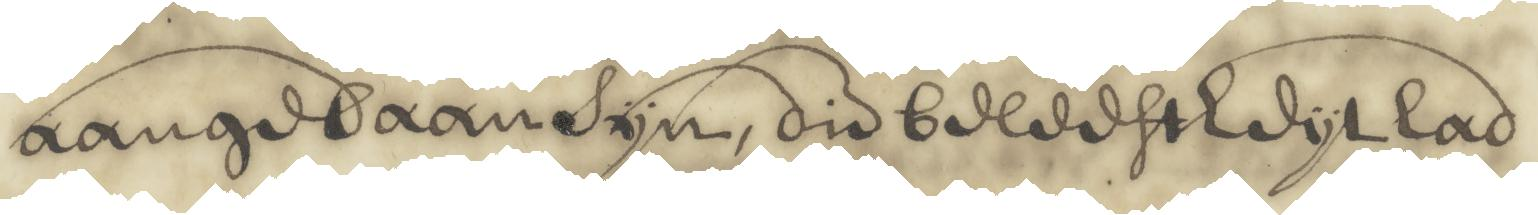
aangedaan sijn, die beleeftheijt had
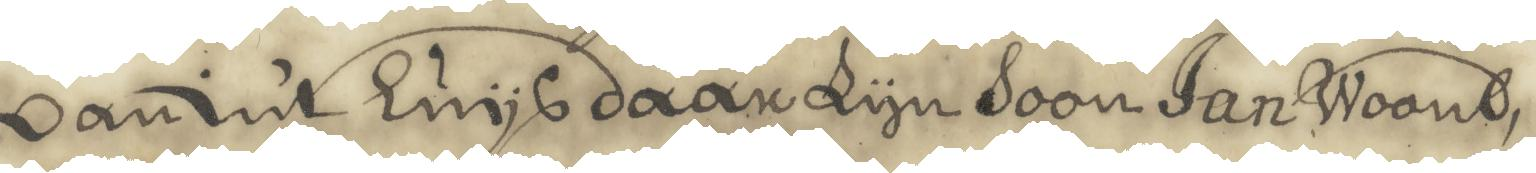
van in't huijs daar zijn soon Ian Woond,
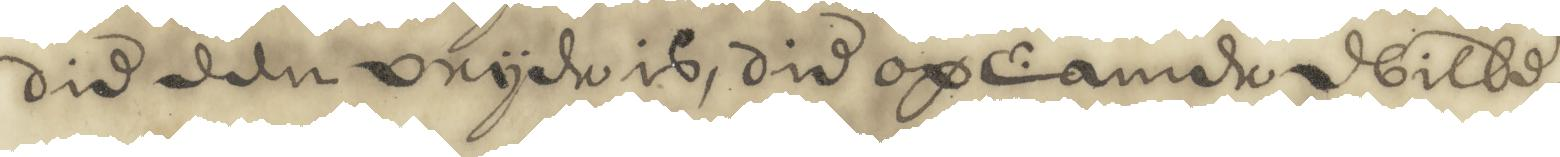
die een vrijer is, die opcamer wilde
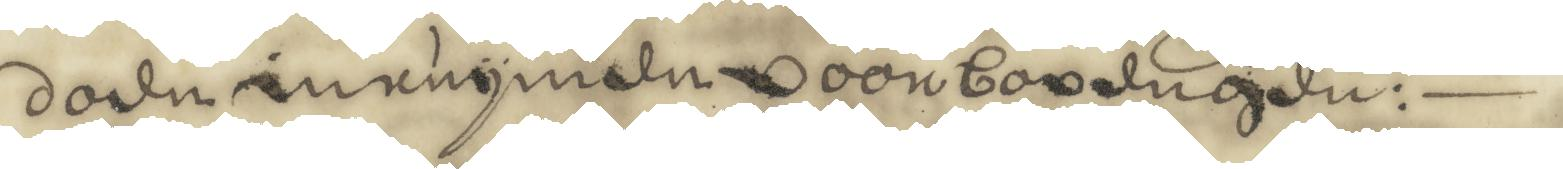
doen inruijmen voor bovengen: —
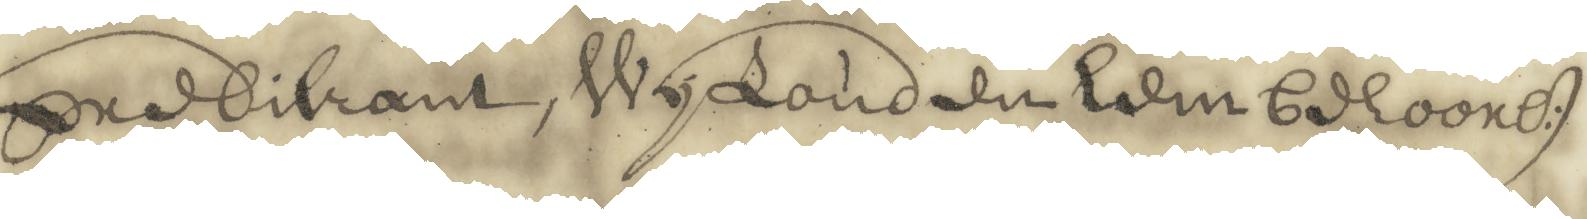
predikant, Wij zouden hem behoorlijk
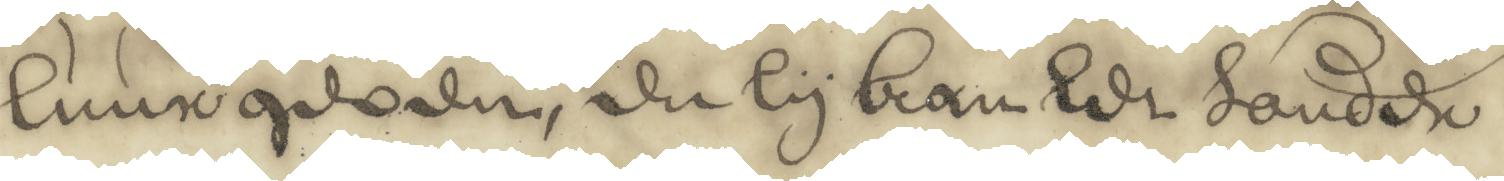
huur geven, en hij kan het sonder
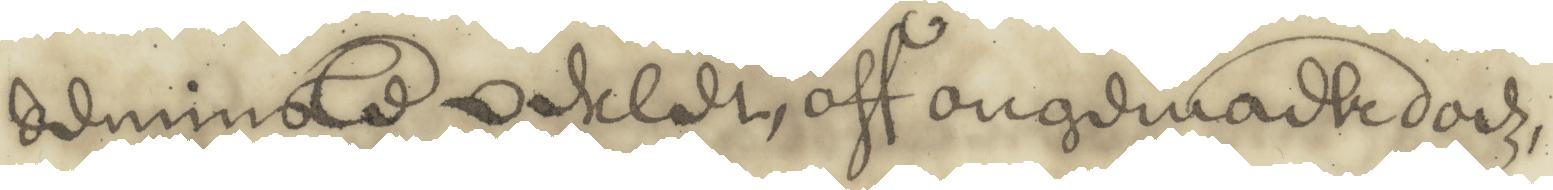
deminste verlet, off ongemaek doen,
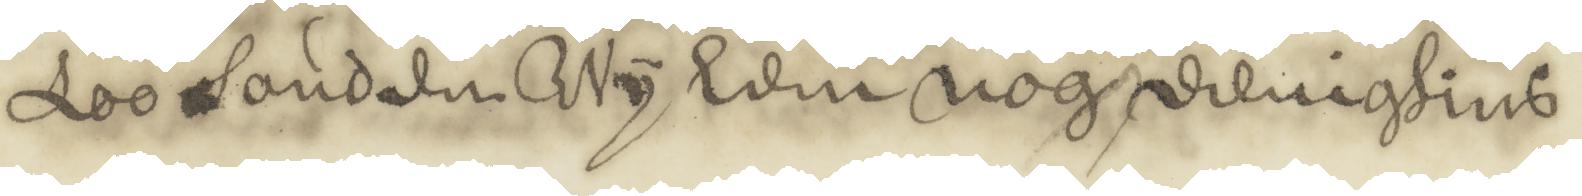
zoo souden wij hem nog eenigsins
